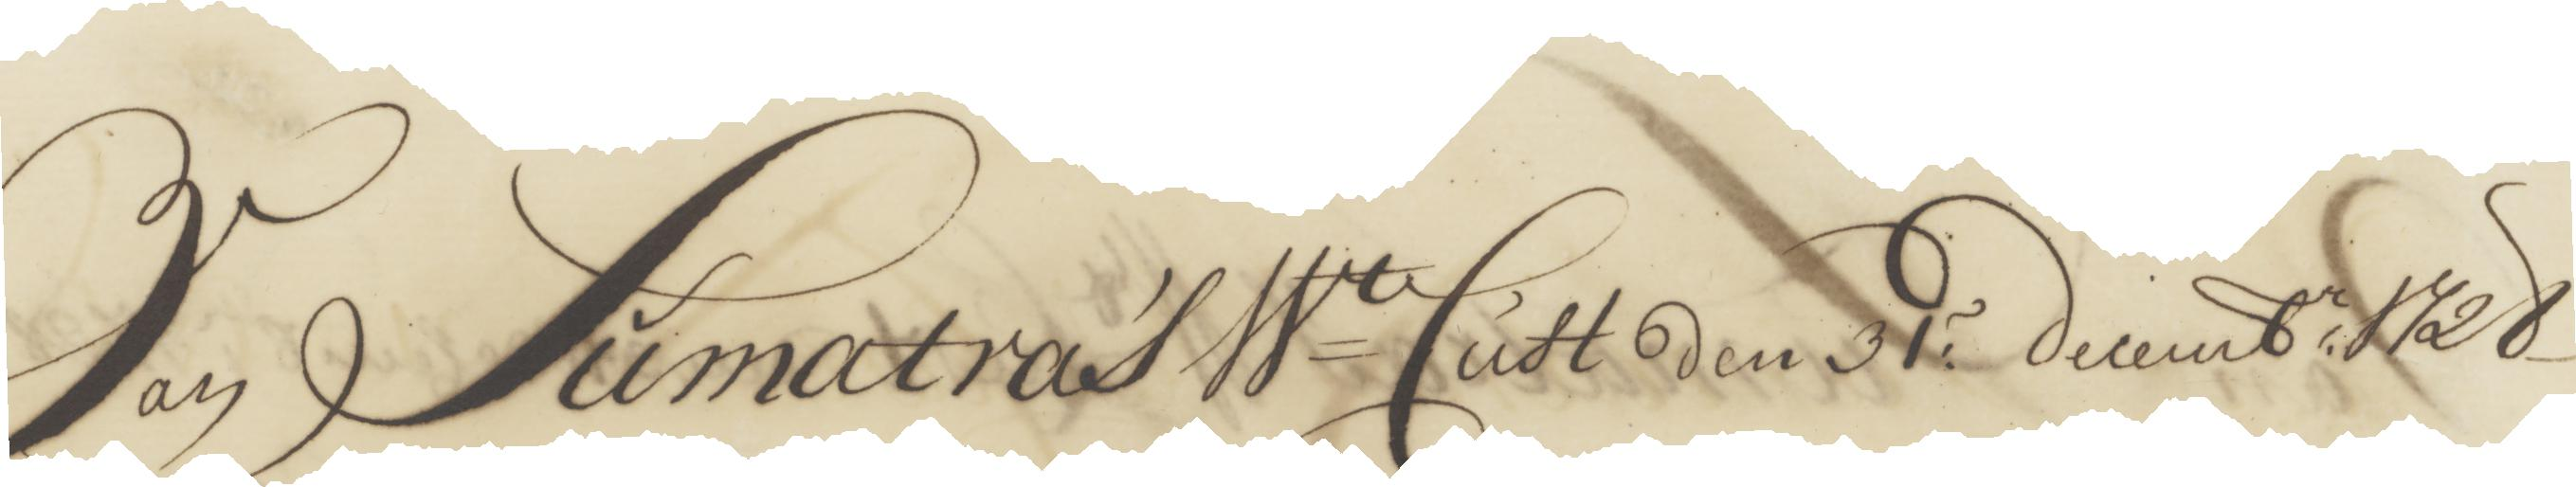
Van Sumatra's W„t Cust den 31:' decemb„r 1728_
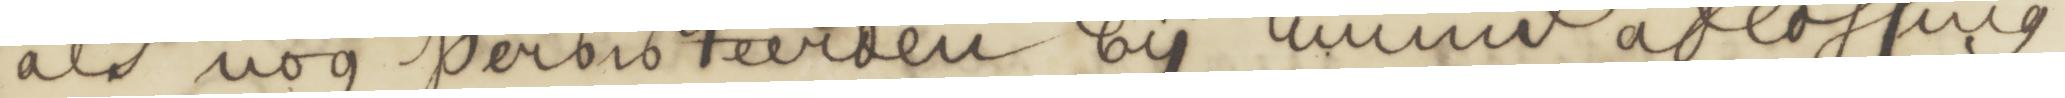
als nog persisteerden bij hunne aflossing
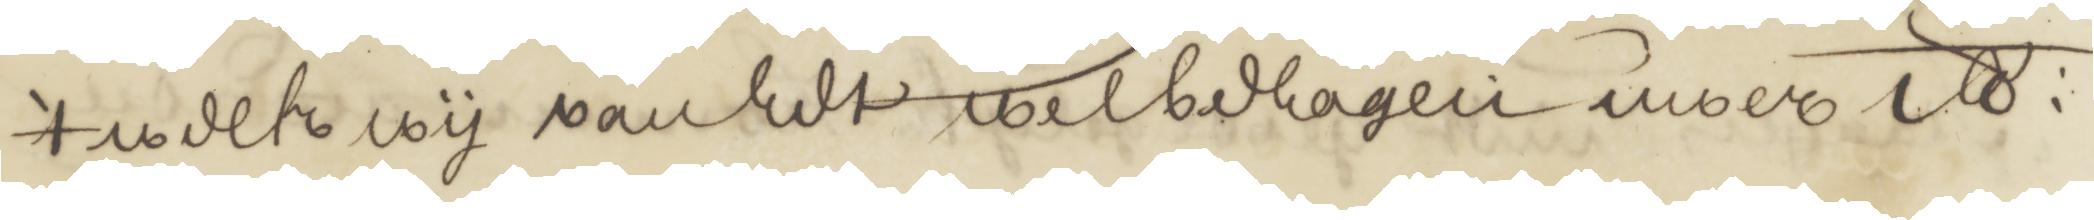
’t welk wij van het welbehagen uwer Ed:
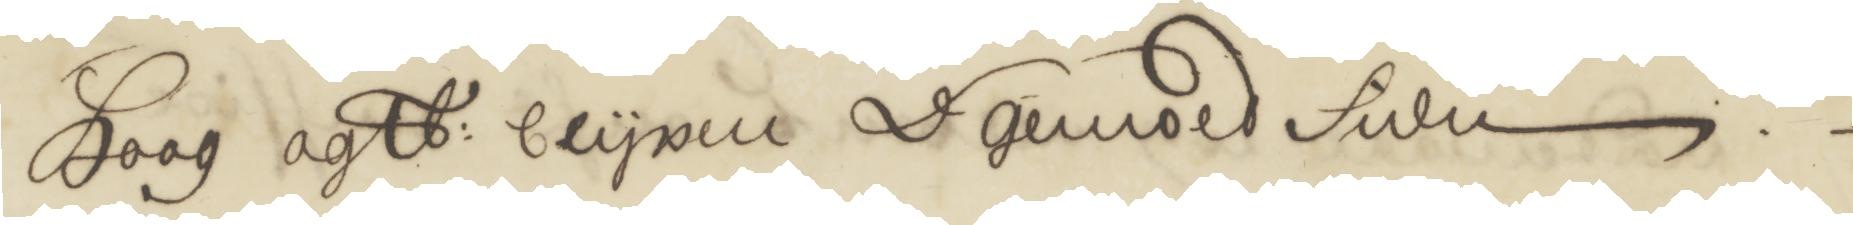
Hoog agtb: blijven te gemoed sien.
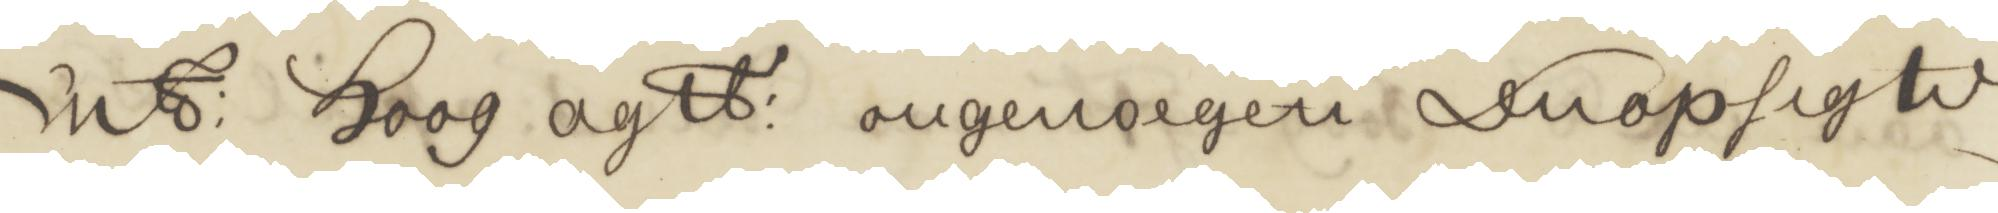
uEd: Hoog agtb: ongenoegen tenopsigte
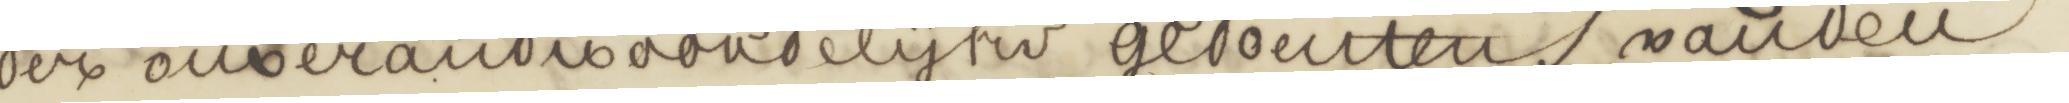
der onverandwoordelijke gedoentens van den
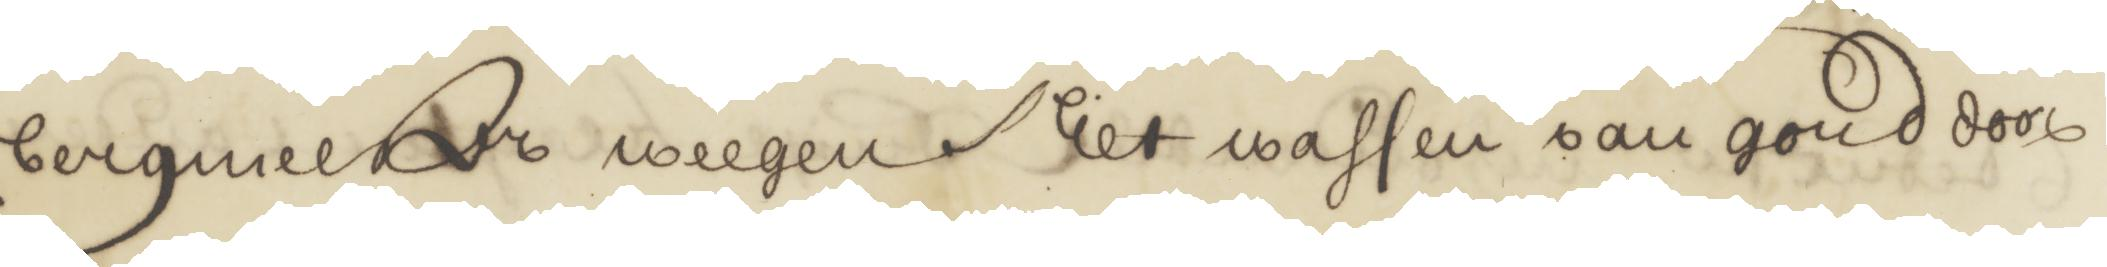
bergmeeter weegens het wassen van goud door
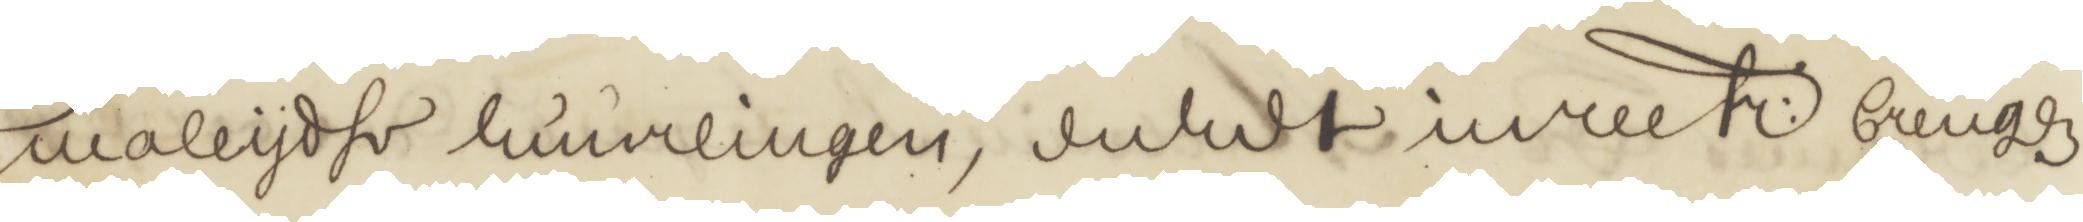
maleijdse huurlingen, en het inreek: brengen
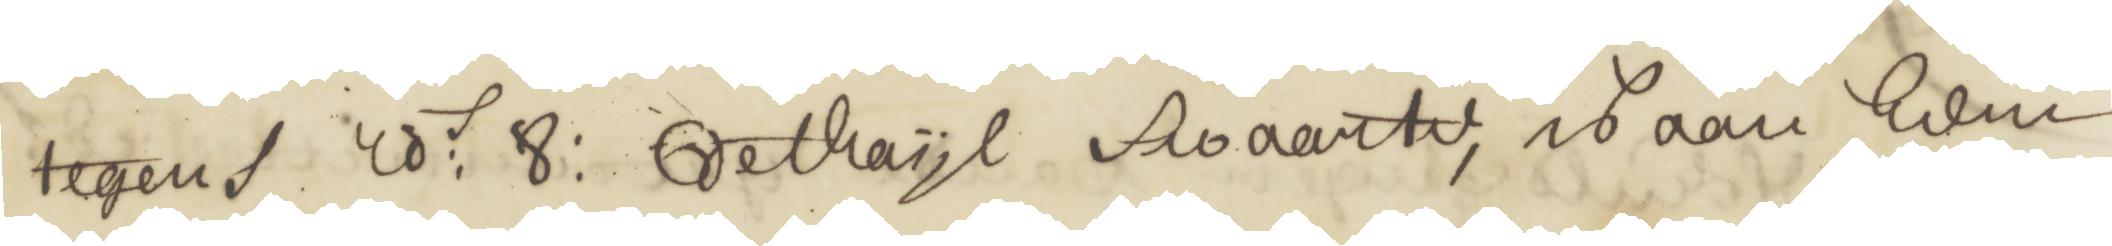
tegens rd:s 8: dethaijl swaarte, is aan hem
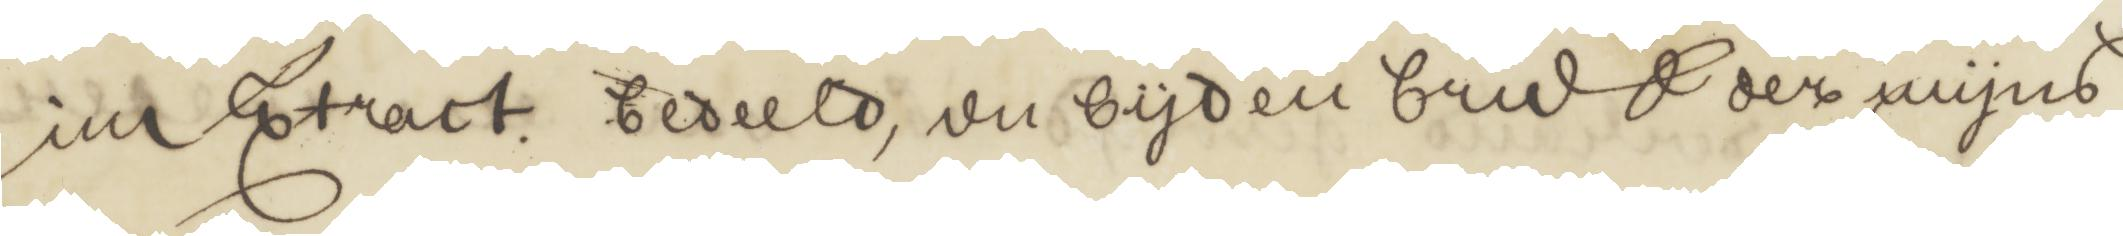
in Extract. bedeeld, en bijden brief der mijns
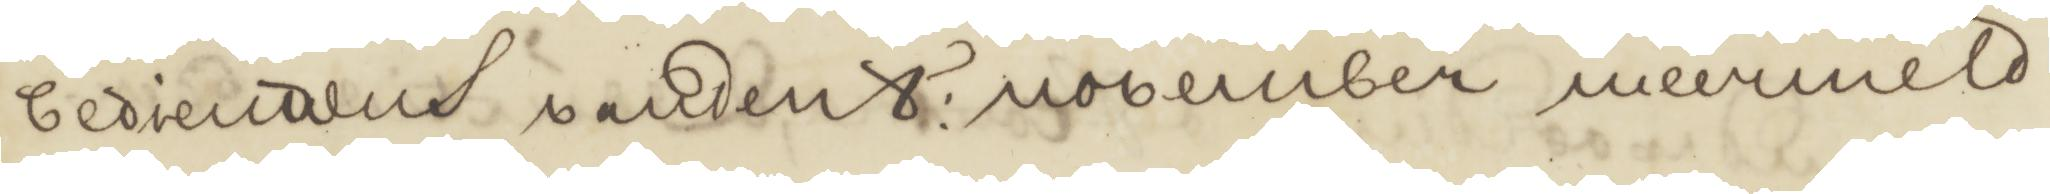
bediendens vanden 8:' november meermeld
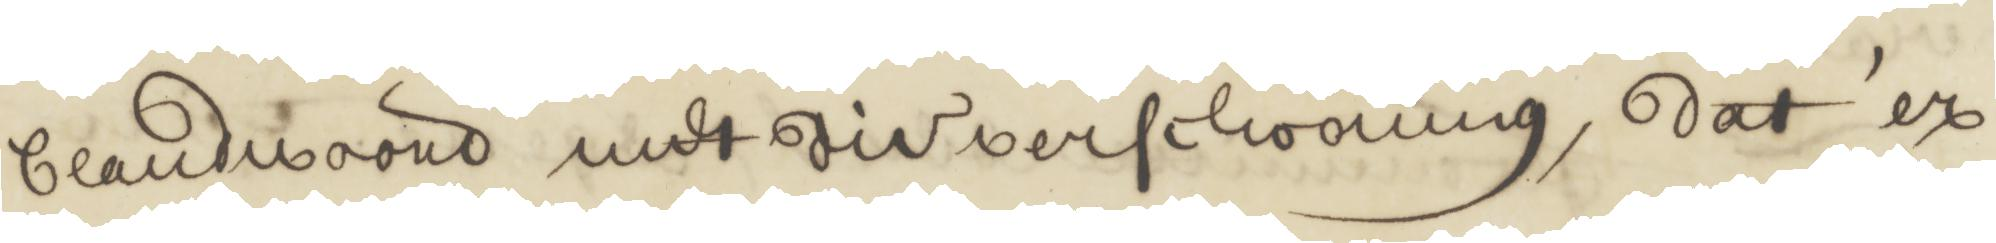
beandwoord met die verschooning, dat 'er
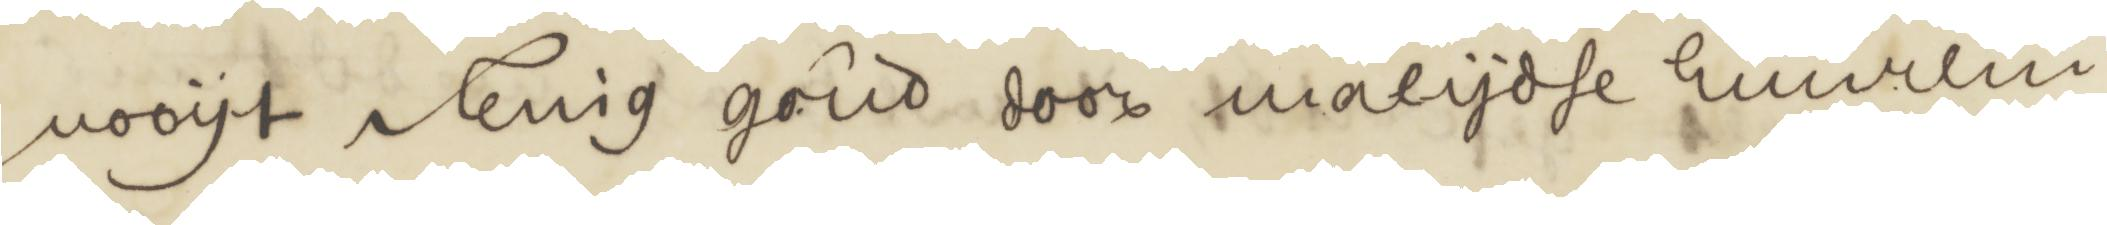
nooijt Eenig goud door malijdse huurlin
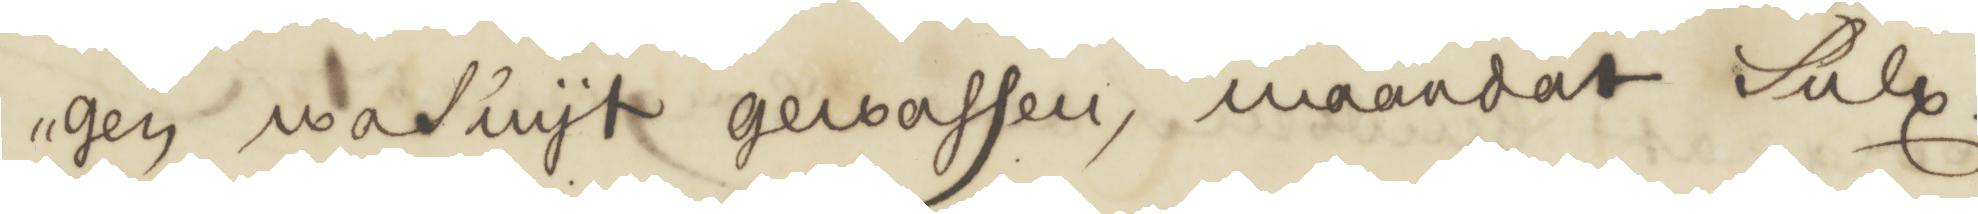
„gen was uijt gewassen, maardat sulx
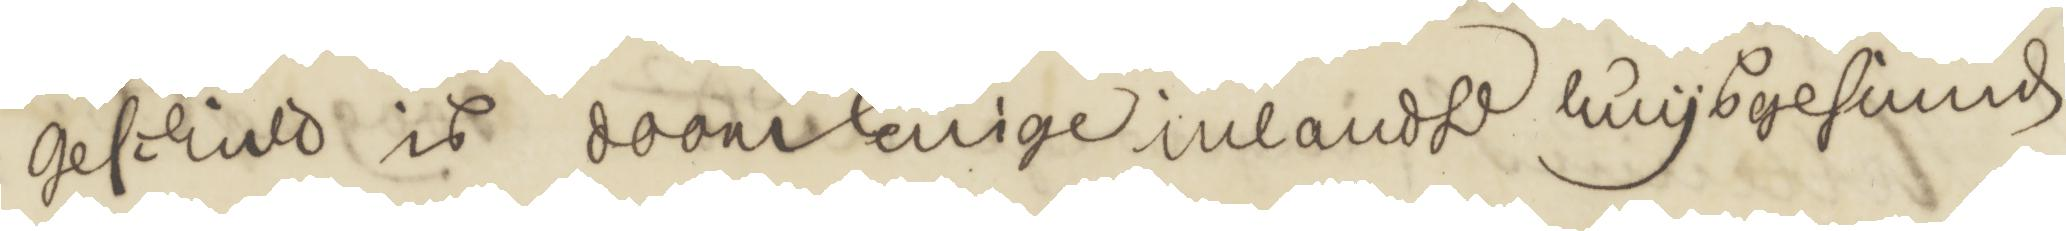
geschied is door Eenige inlandse huijsgesinnen
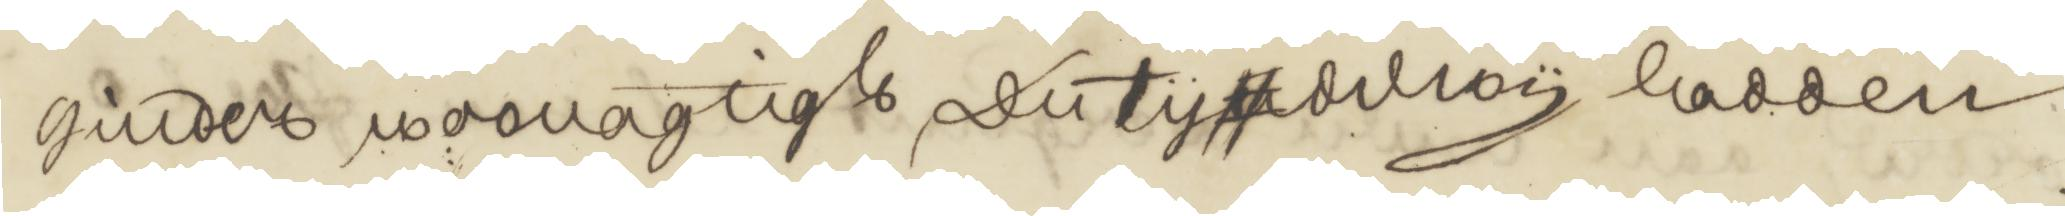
ginder woonagtigh ten tijdede wij hadden
